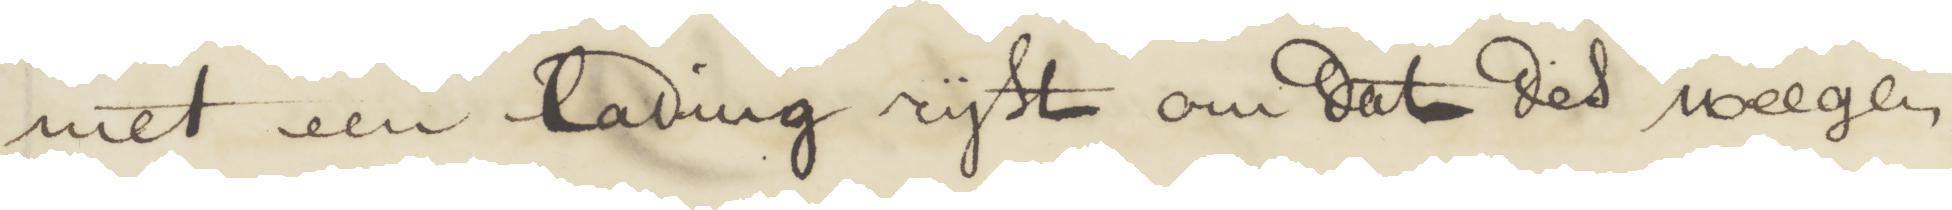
met een lading rijst om dat des weegen
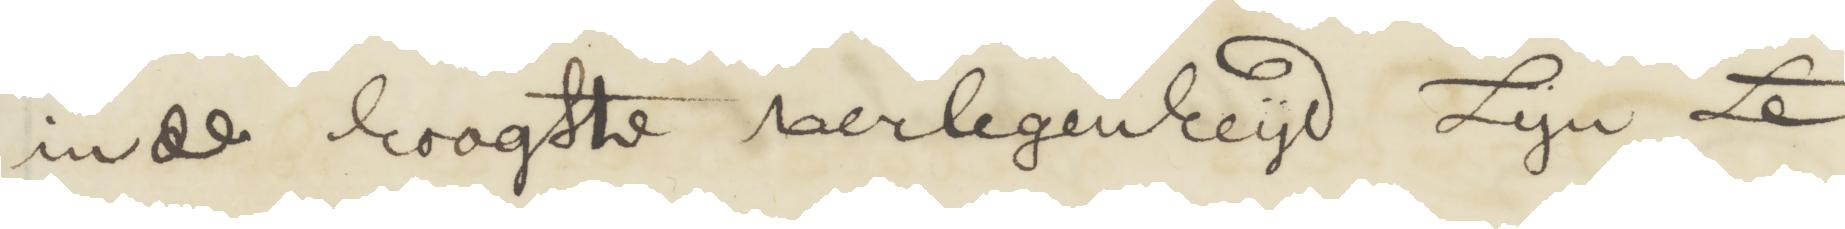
in de hoogste verlegenheijd zijn te
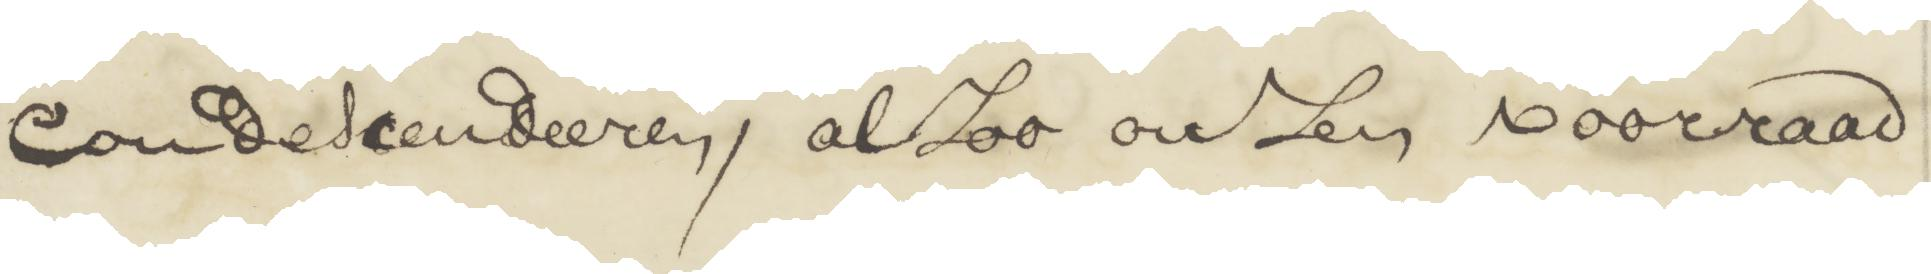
condescendeeren, alzoo onzen voorraad
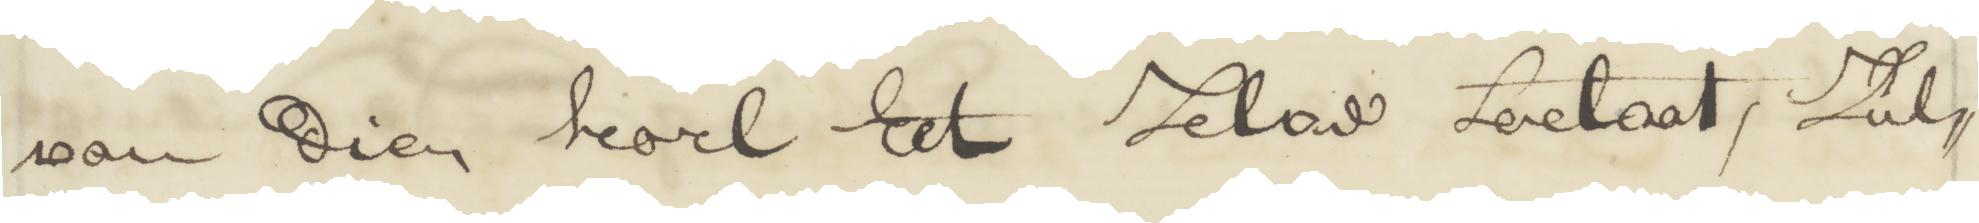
van dien korl het zelve toelaat, zul„
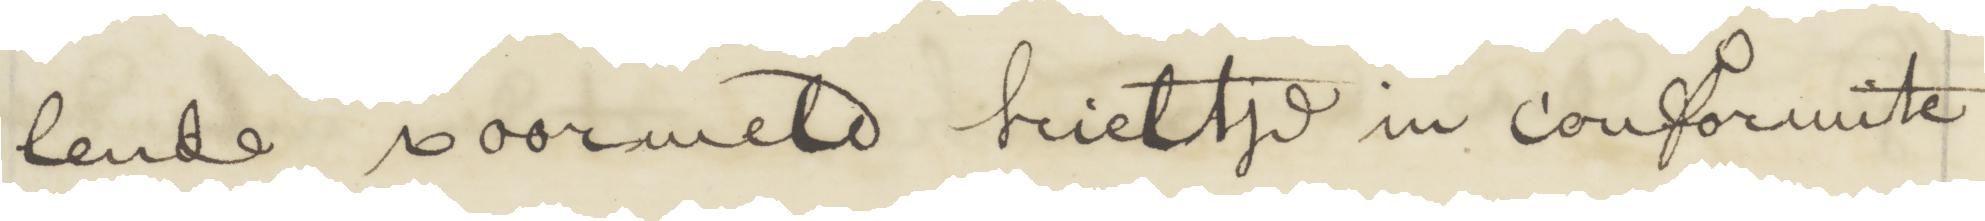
lende voormeld kieltje in conformite
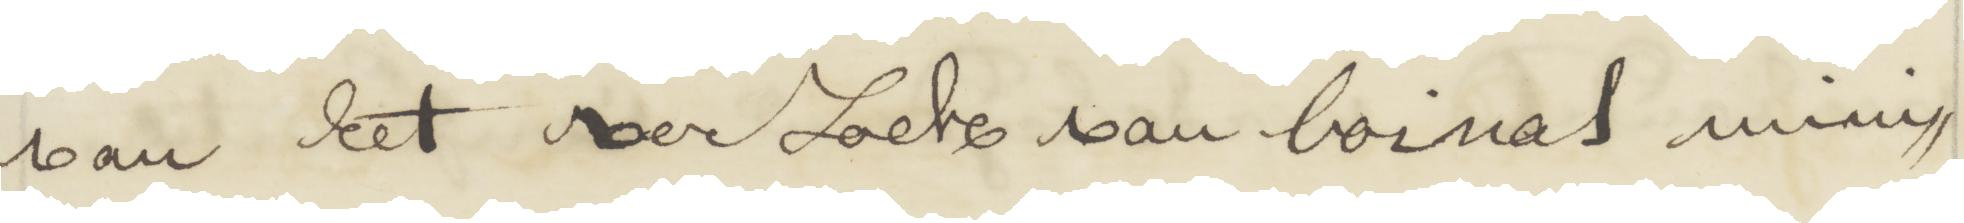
van het verzoek van boinas mini„
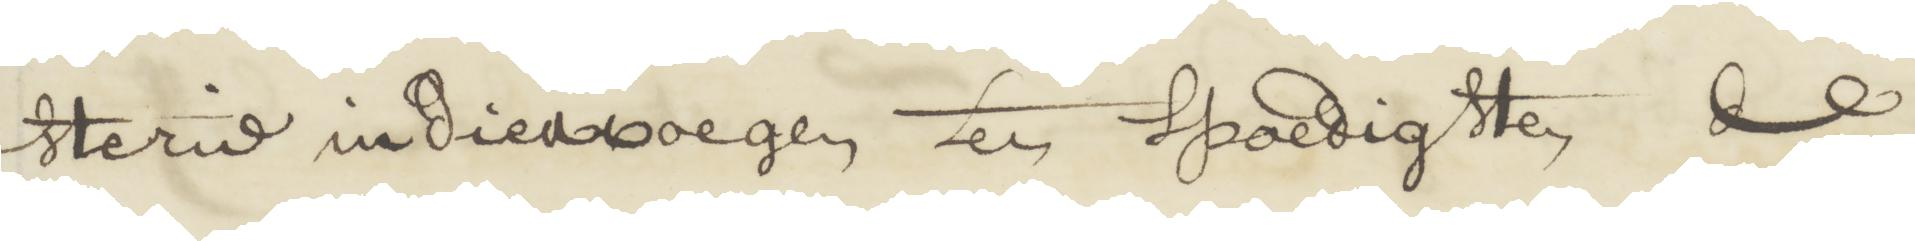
sterie in diervoegen ten spoedigsten de
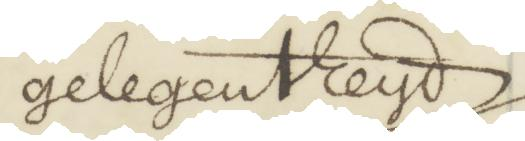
gelegentheijd
